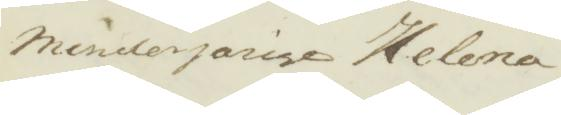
minderjarige Helena
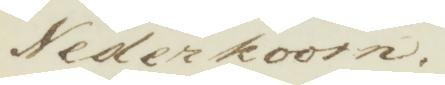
Nederkoorn.
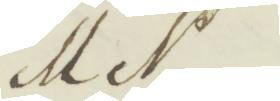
M N
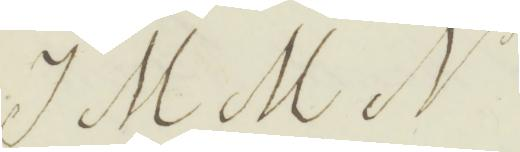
J M M N
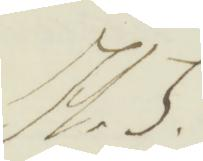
H. S.
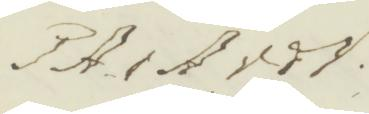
P A , A v d V
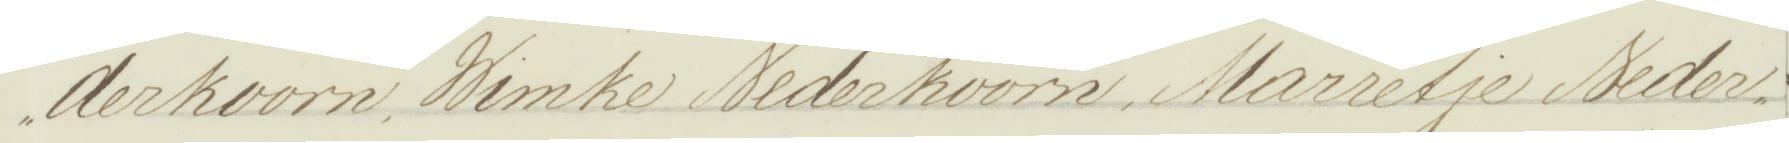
„derkoorn, Wimke Nederkoorn, Marretje Neder„
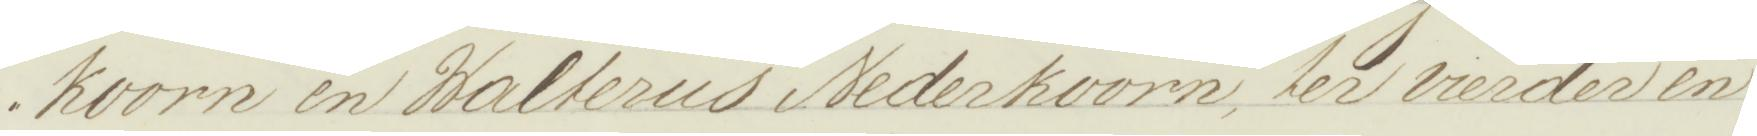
„koorn en Walterus Nederkoorn, ter vierder en
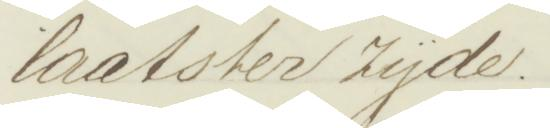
laatster zijde.
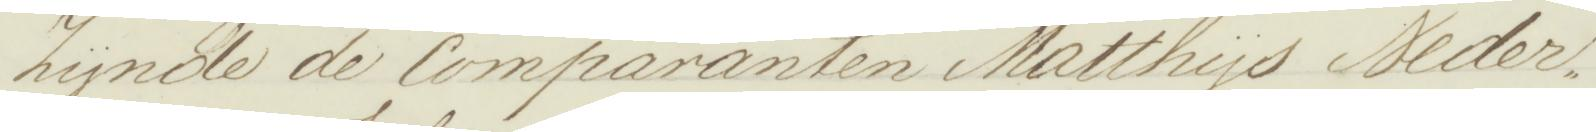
Zijnde de Comparanten Matthijs Neder„
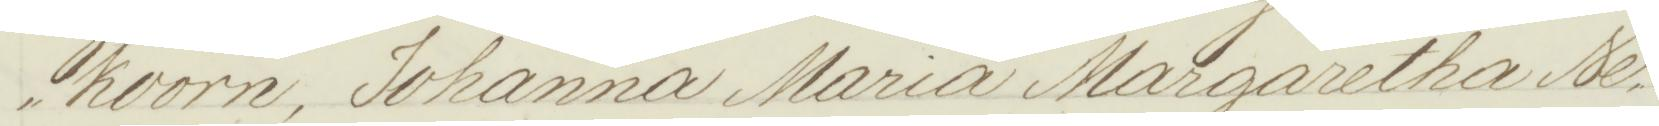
„koorn, Johanna Maria Margaretha Ne„
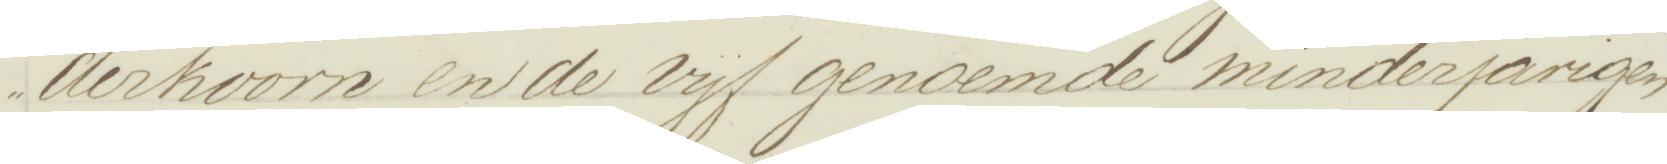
„derkoorn en de vijf genoemde minderjarigen
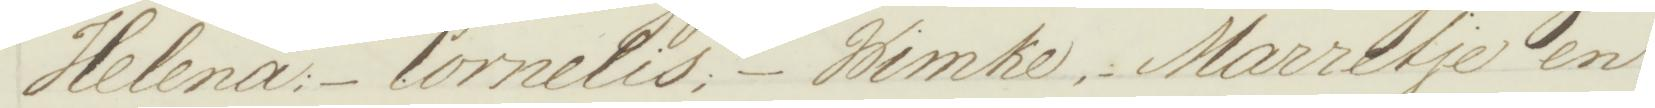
Helena; – Cornelis; – Wimke, - Marretje en
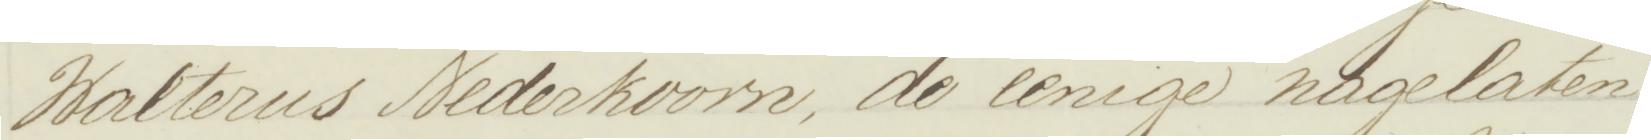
Walterus Nederkoorn, de eenige nagelaten
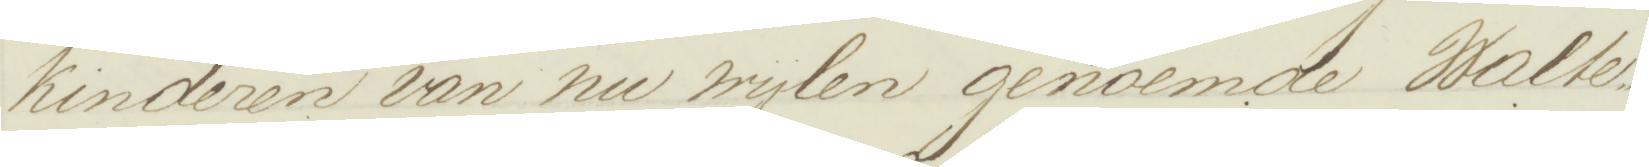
kinderen van nu wijlen genoemde Walte„
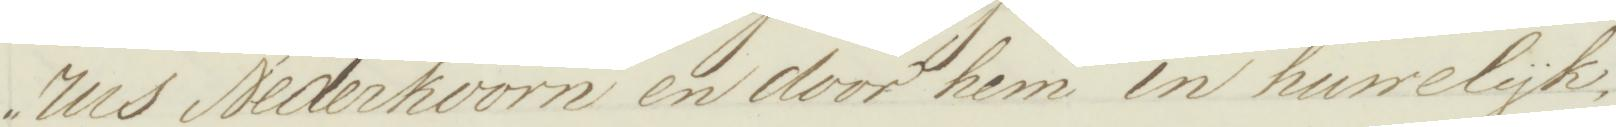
„rus Nederkoorn en door hem in huwelijk,
